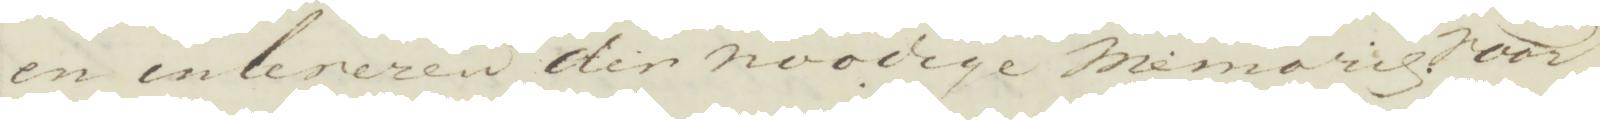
en inleveren der noodige memoris voor
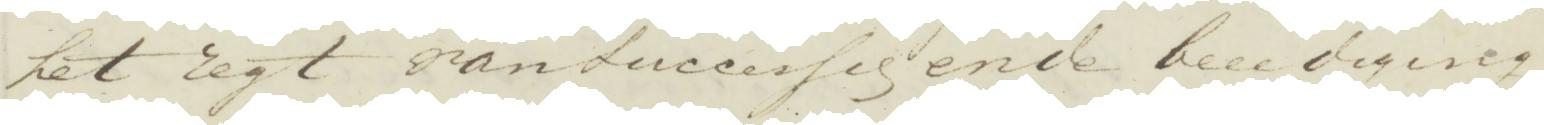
het regt van successie ende beeediging
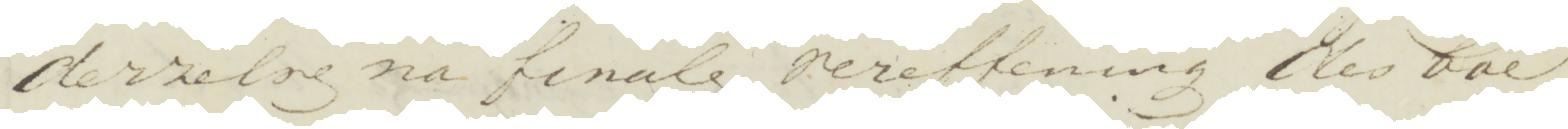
derzelve na finale vereffening des boe
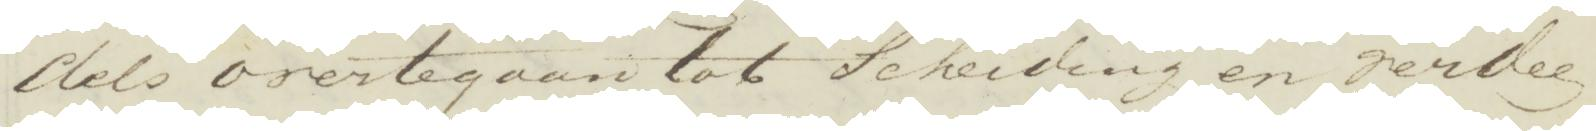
dels overtegaan tot scheiding en verdee
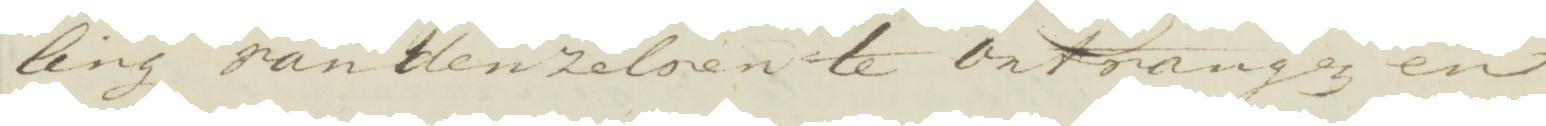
ling van denzelven te ontvangen en
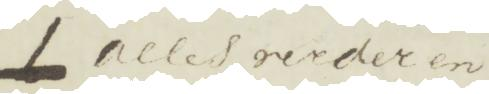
¶ alles verder en
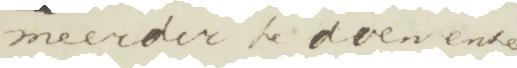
meerder te doen ente
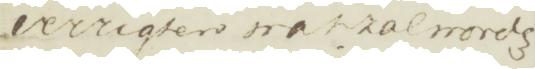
verrigten wat zal worden
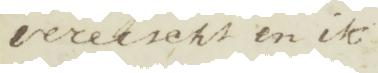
vereischt en ik
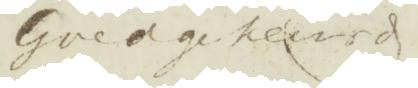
Goedgekeeurd
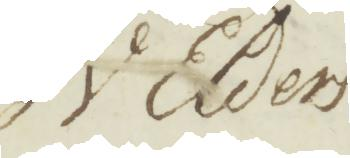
C W Elders
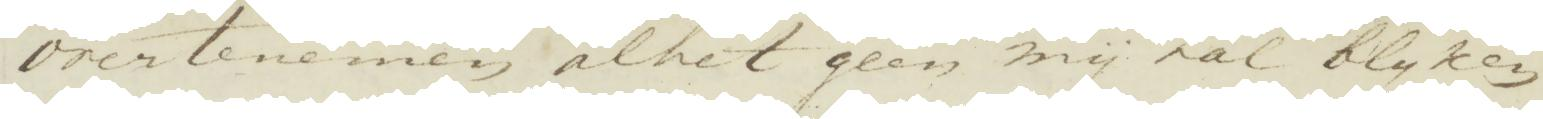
overtenemen alhet geen mij zal blyken
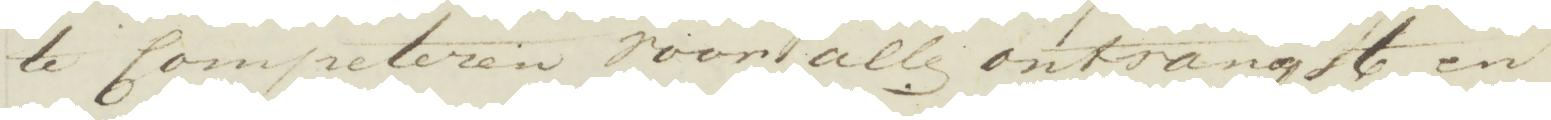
te Competeren voor alle ontvangst en
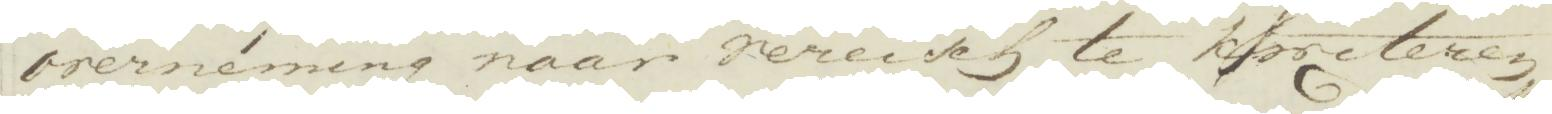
overneming naar vereisch te kwiteren,
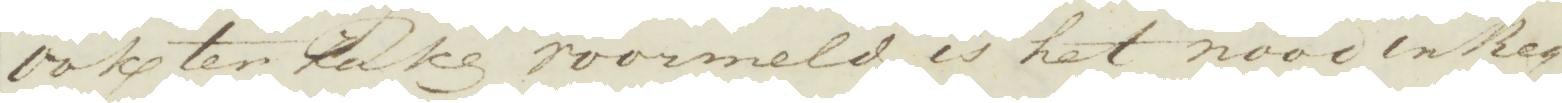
ook ter zake voormeld is het nood in Reg
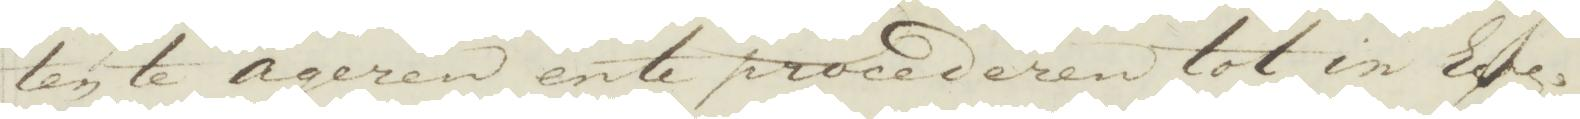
ten te ageren ente procederen tot in Exce„
